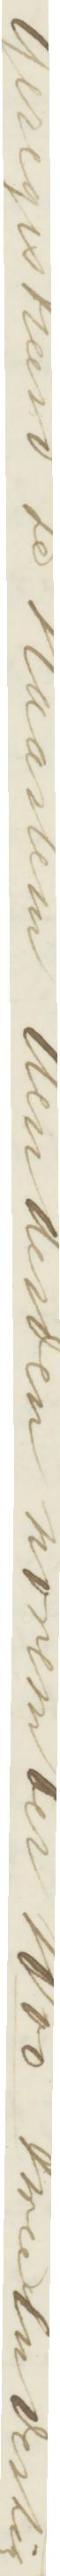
Geregistreerd te Haarlem den derden november 18-- twee en dertig
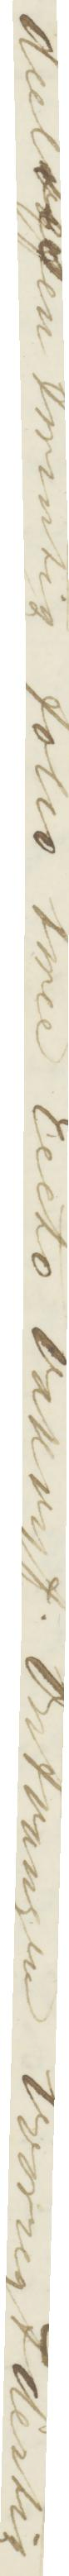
deel zesen twintig folio twee rector vak vyf: Ontvangen voorregt dertig
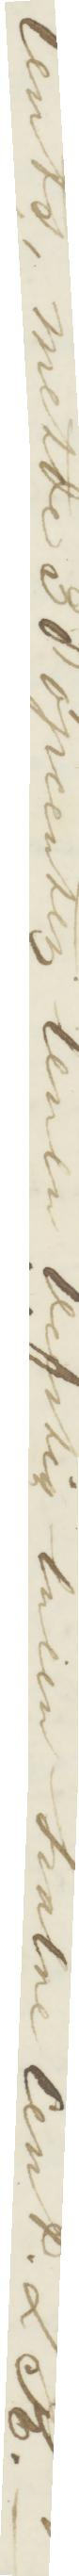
Cents, met de 38 opcenten, Eenen veertig en een halve Cent. ZR.
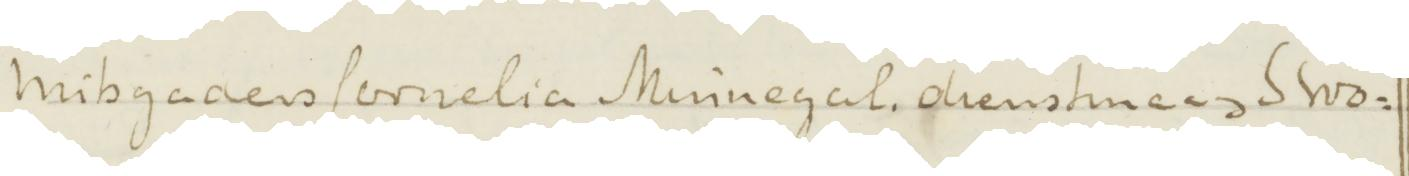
Mitsgaders Cornelia Minnegal, dienstmaagd wo=
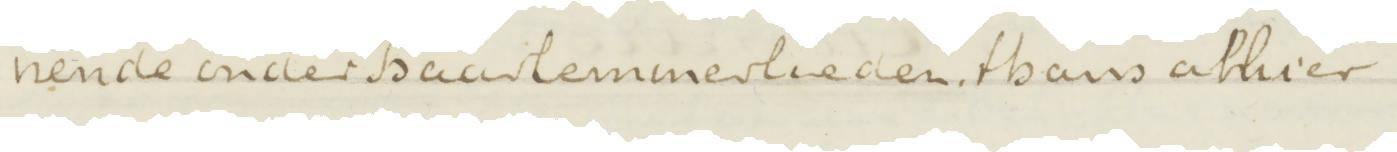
=nende onder Haarlemmerlieden thans alhier
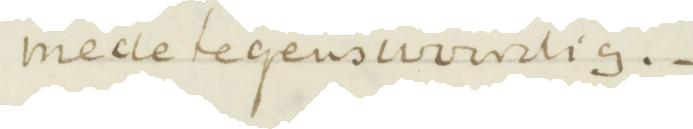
mede tegenwoordig.
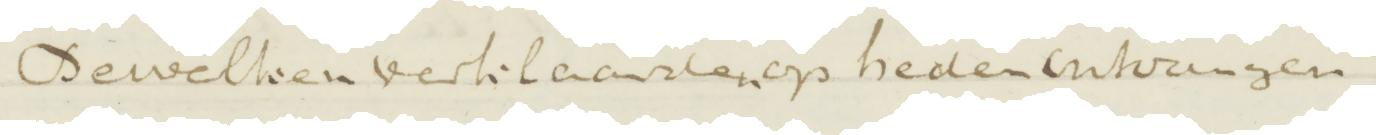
Dewelken verklaarden op heden ontvangen
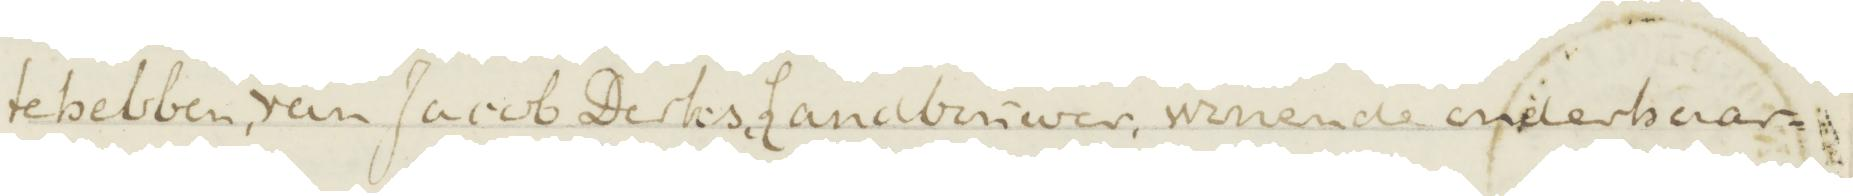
te hebben van Jacob Derks, Landbouwer, wonende onder haar=
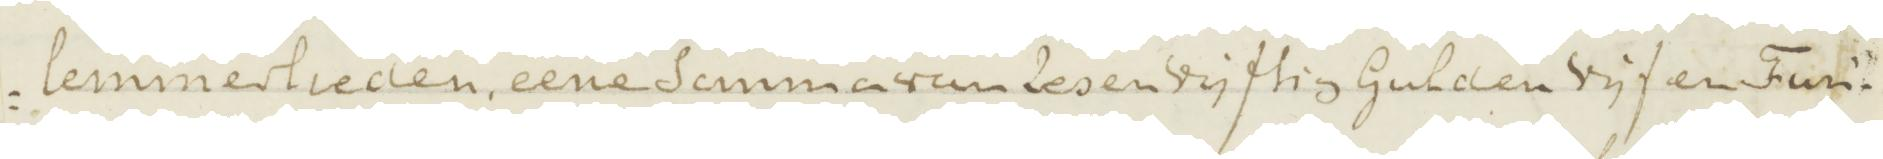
„lemmerlieden, eene somma van zes en vijftig Gulden vijf en Twin-
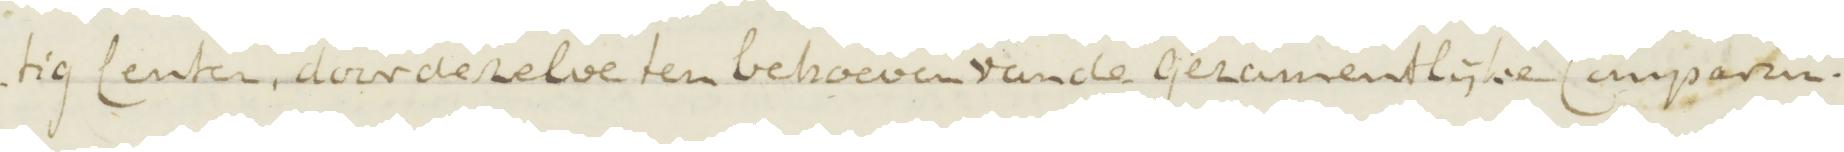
„tig Centen, door dezelve ten behoeven van de gezamentlijke Comparan-
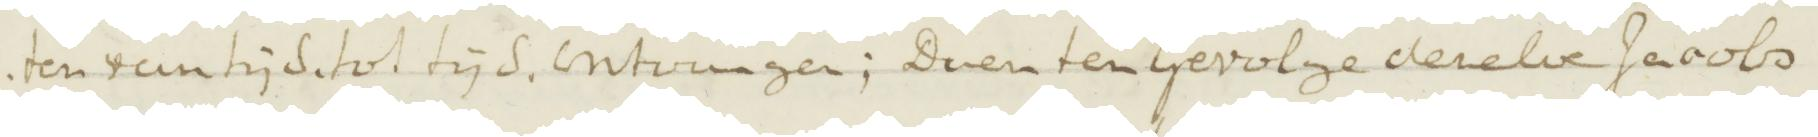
„ten van tijd tot tijd, ontvangen; Doen ten Gevolge dezelve Jacobs
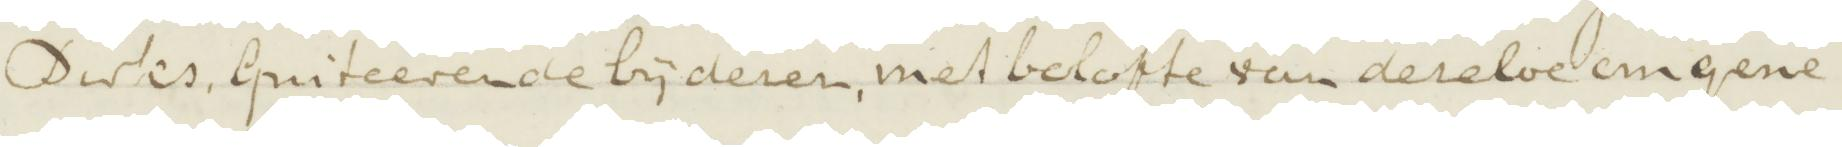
Dirks, quiteerende bij dezen, met belofte van dezelve om gene
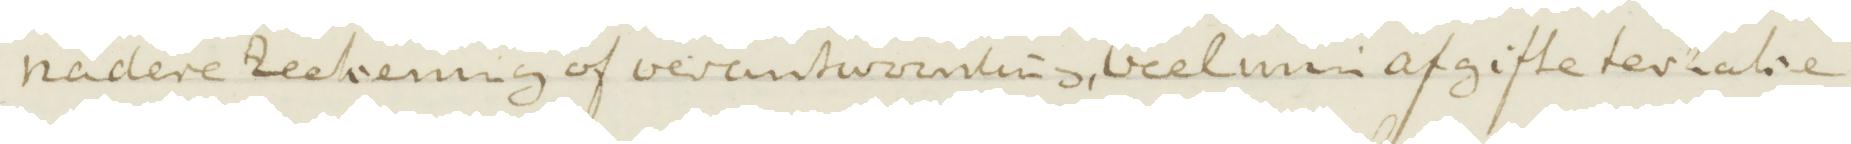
nadere reekening of verantwoording, veel min afgifte terzake
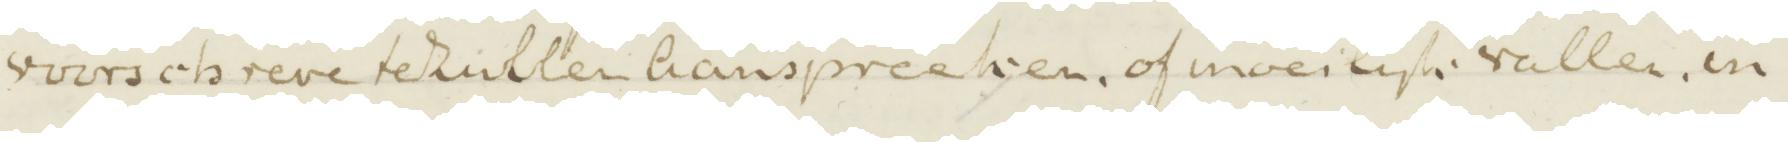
voorschreve te zullen aanspreeken, of moeilyk vallen, in
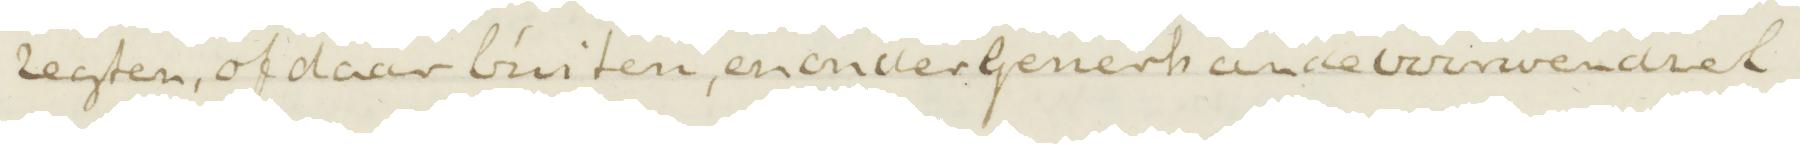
regten, of daar buiten, en onder Generhande voorwendzel
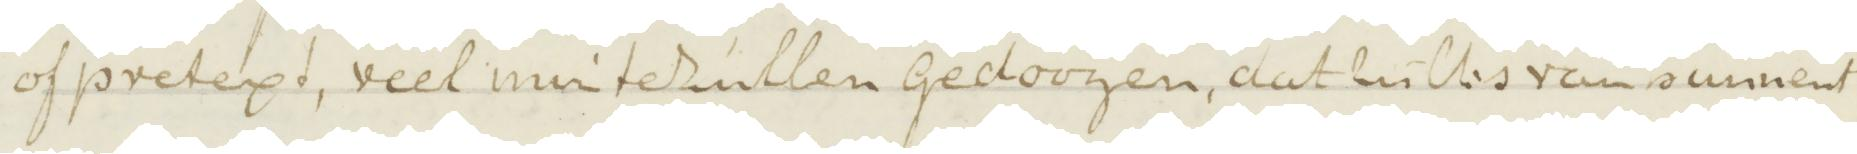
of pretext, veel min te zullen gedoogen, dat zulks van hunnent
